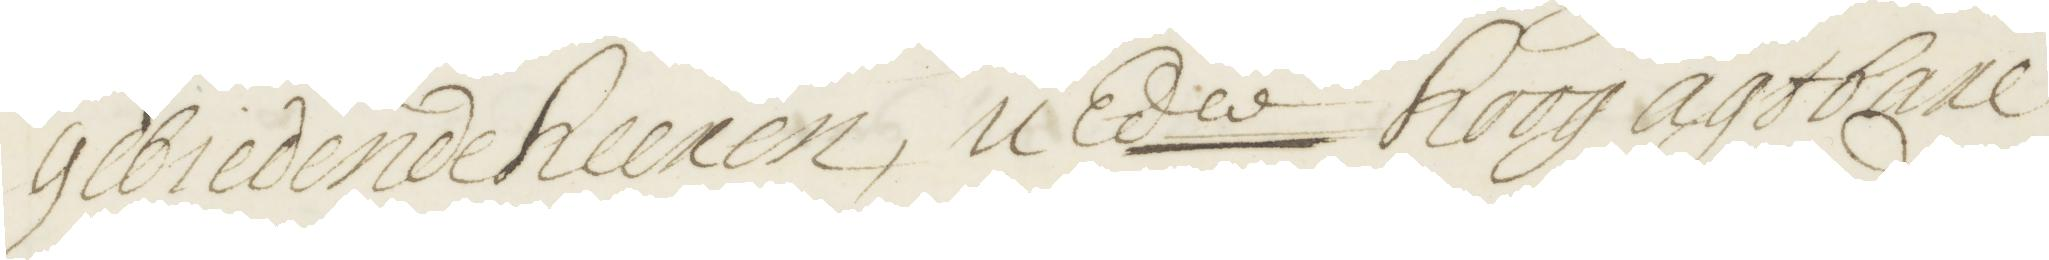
gebiedende heeren, u Ed=le hoog agtbare
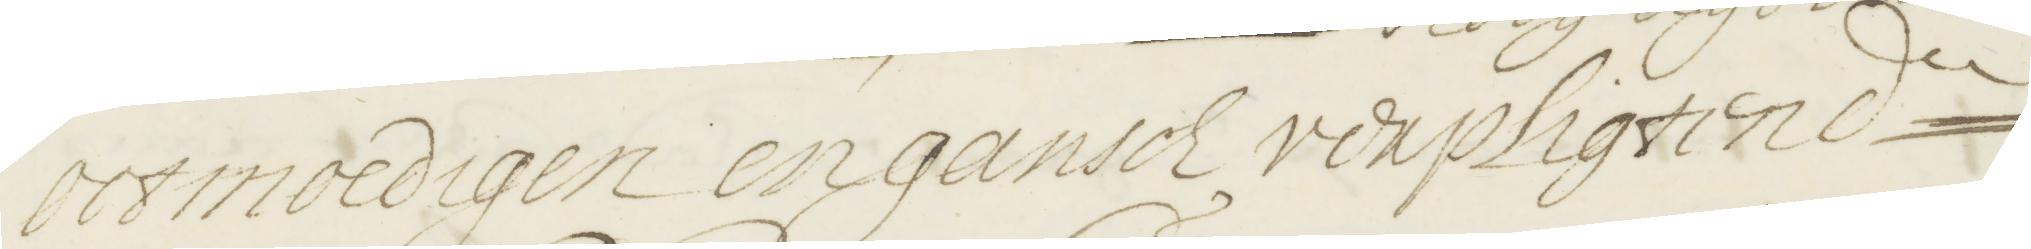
ootmoedigen en gansch verpligtend:e
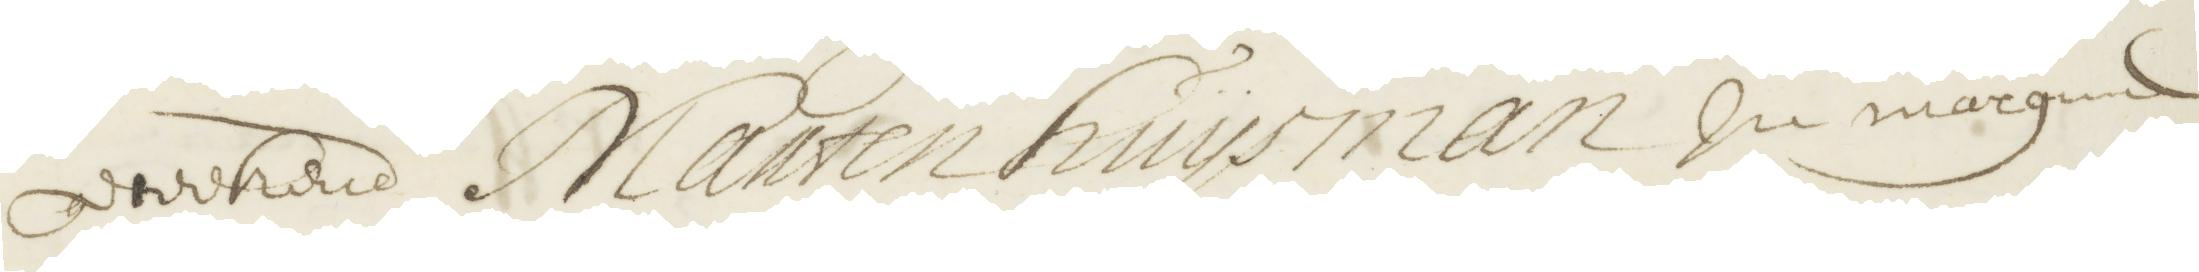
geteekend Marten huijsman Jn margine
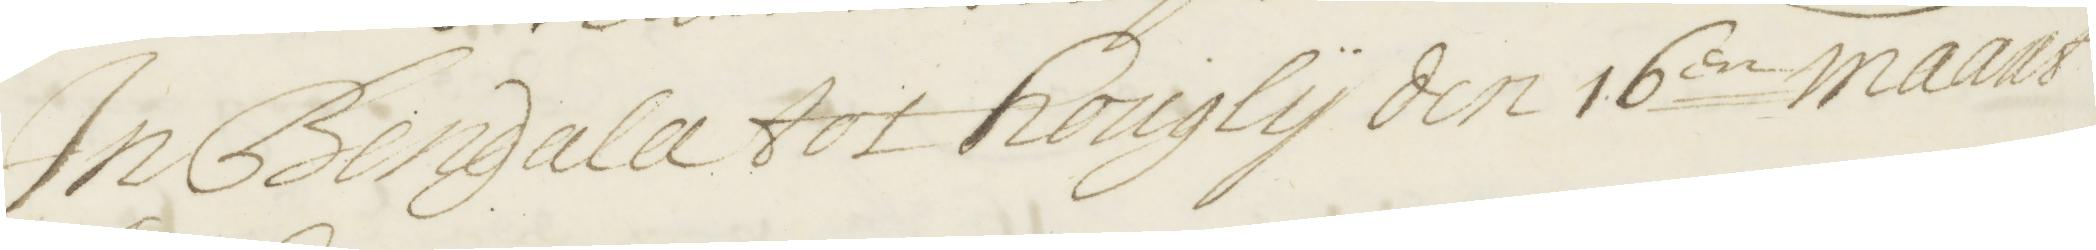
Jn Bengala tot houglij den 16=en maart
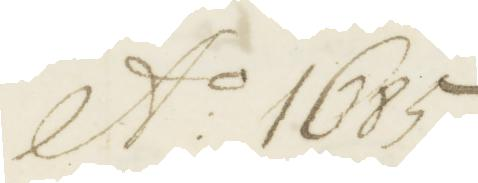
A:o 1685.
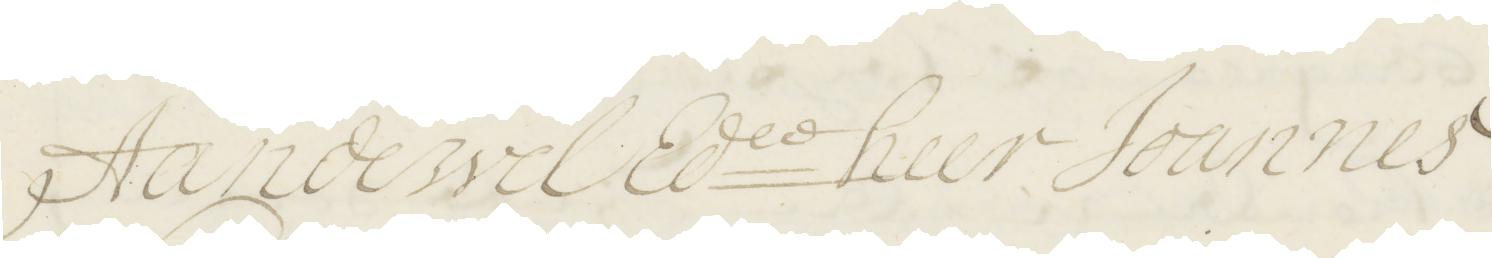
Aan de wel Ed=le heer Ioannes
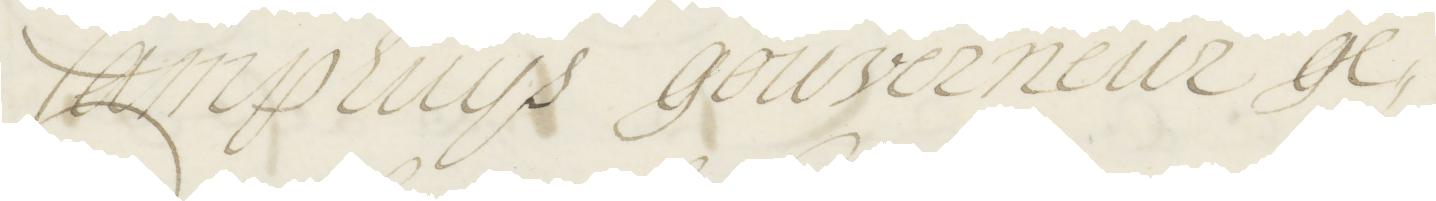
Camphuijs gouverneur ge„
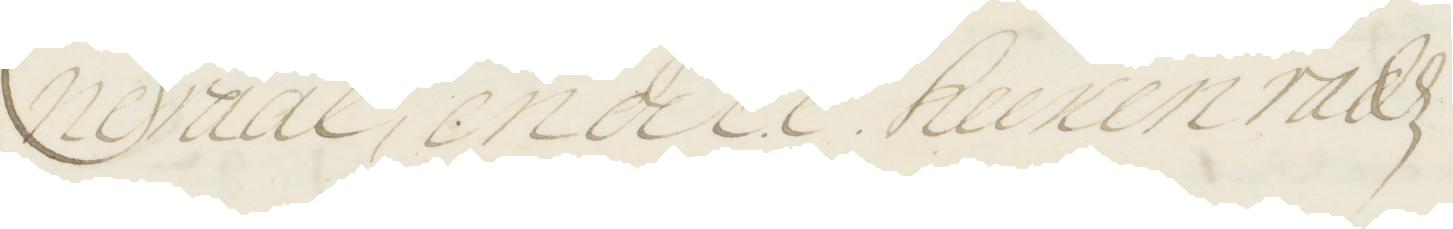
neraal, en de E.E. heeren raden
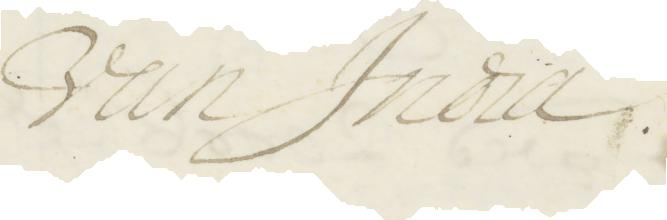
Van Jndia.
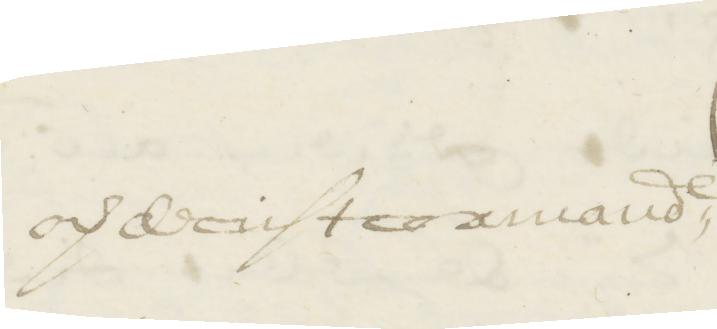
over de cust cormand„l
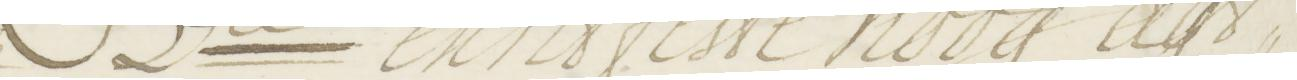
ED=le Erntfeste hoog agt„
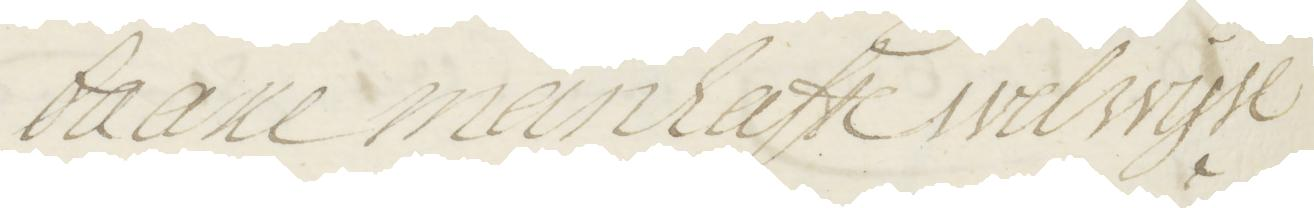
baare manhaffe wel wijse
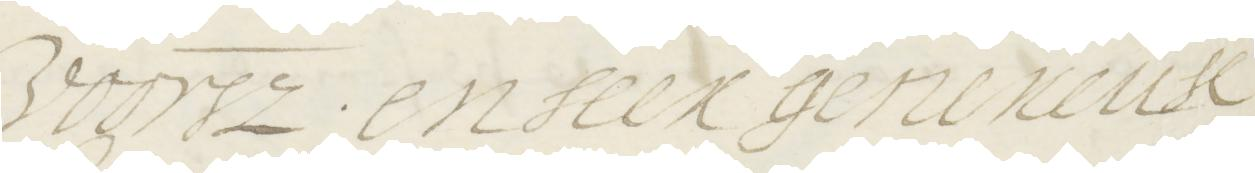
voorsz en seer genereuse
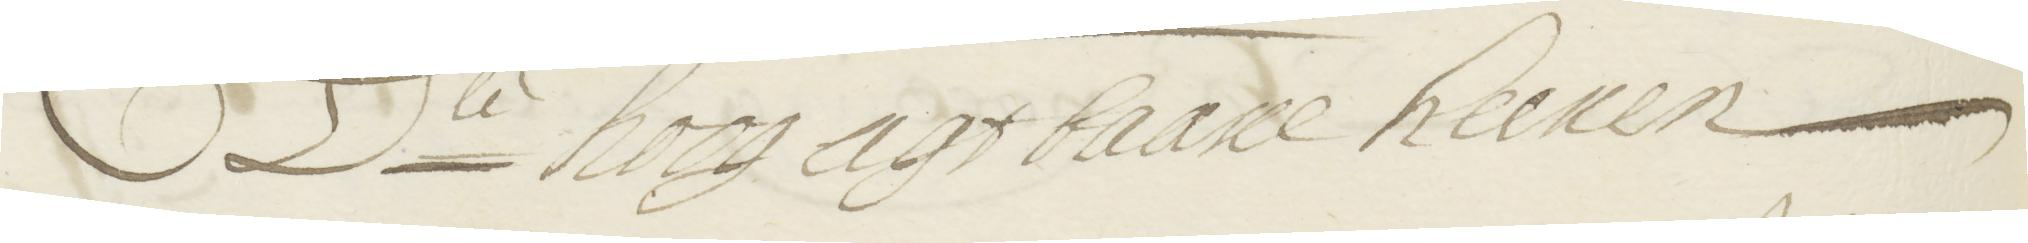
ED=le hoog agtbaare heeren
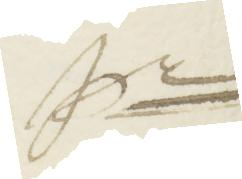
p=r
